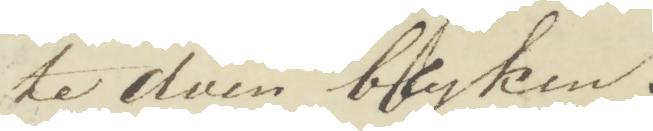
te doen blyken.
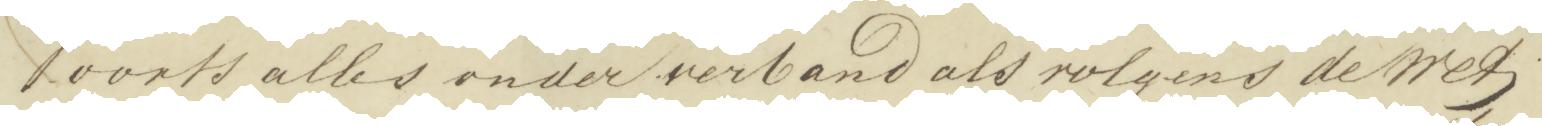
Voorts alles onder verband als volgens de wet
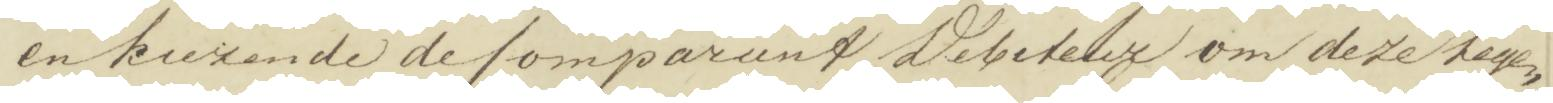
en kiezende de Comparant Debiteur om deze tegen„
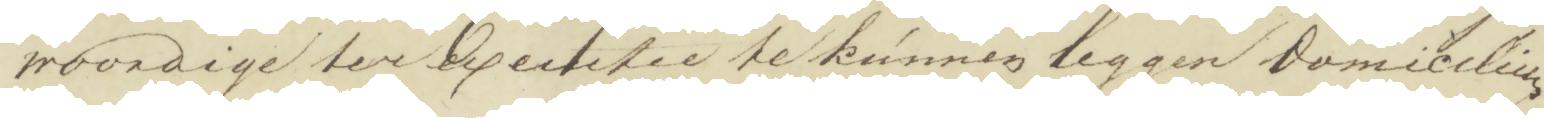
woordige ter Executie te kunnen leggen Domicilien
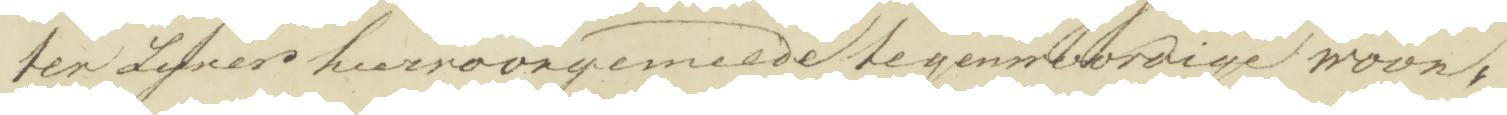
ter zyner hiervoorgemelde tegenwoordige woon„
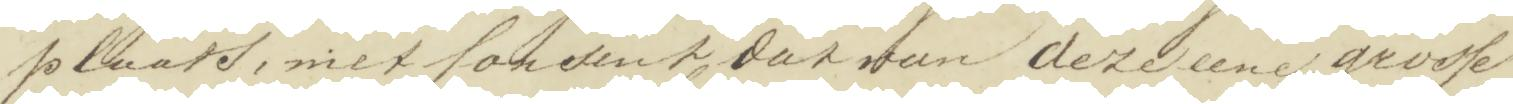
plaats, met Consent dat van deze eene grosse
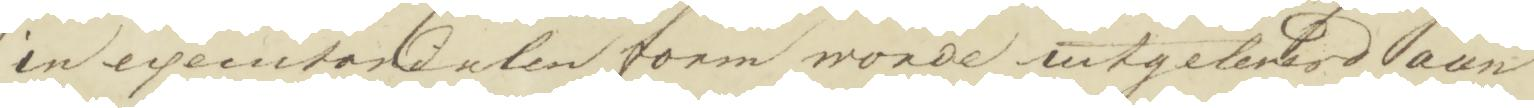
in executorerlen form worde uitgeleverd aan
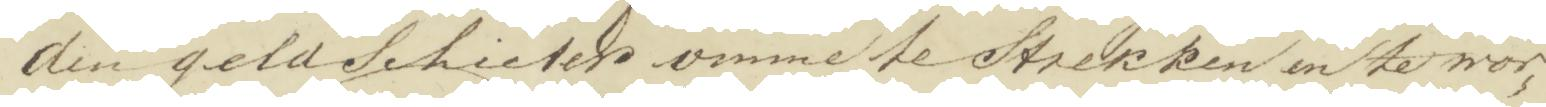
den geldschieter omme te strekken en te wor„
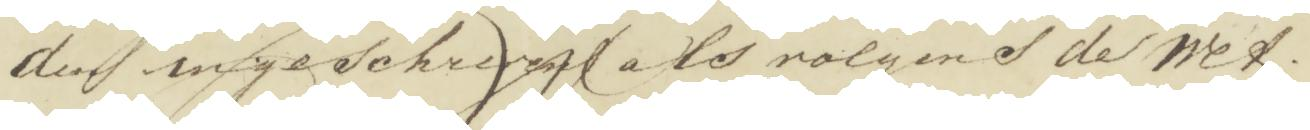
den ingeschreven als volgens de wet.
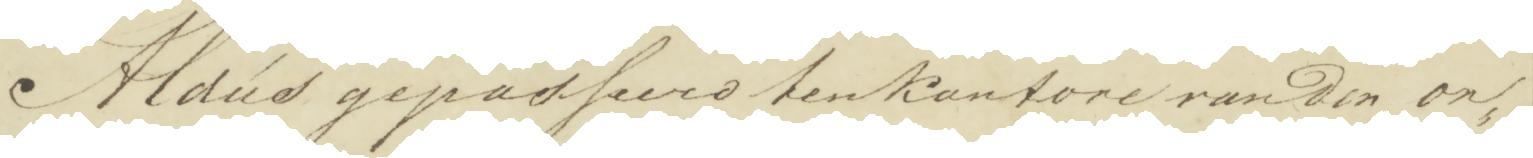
Aldus gepasseerd ten kantore van den on„
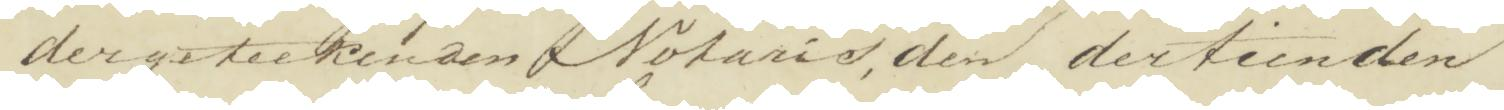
dergeteekenden Notaris, den dertienden
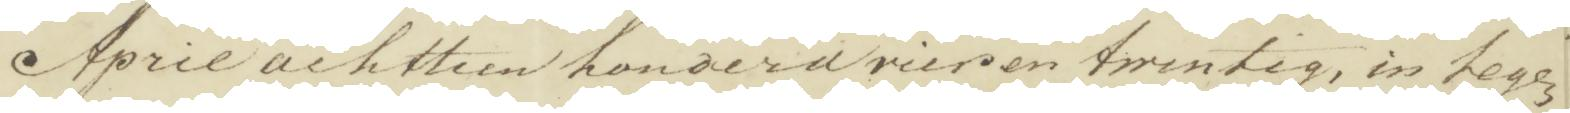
April achttien honderd vier en twintig, in tegen
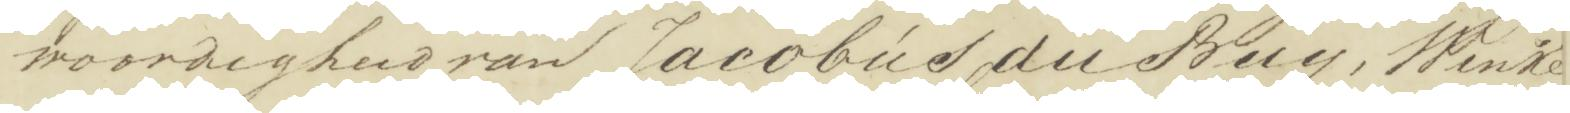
woordigheid van Jacobus, du Buy, Winke
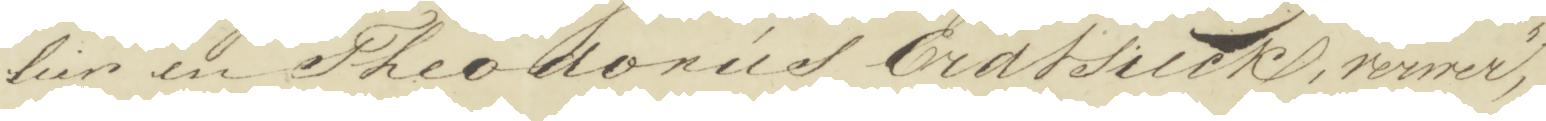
lier en Theodorus Erdtsiecks, verwer,
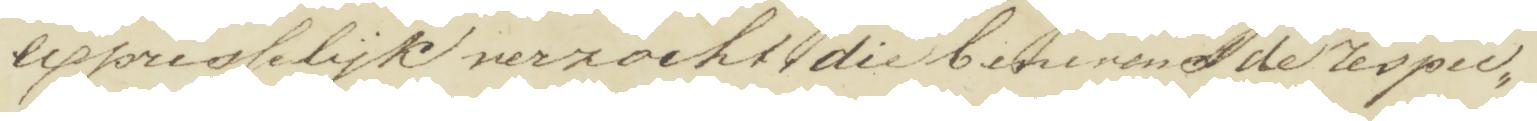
expresselijk verzocht, die benevens de respec„
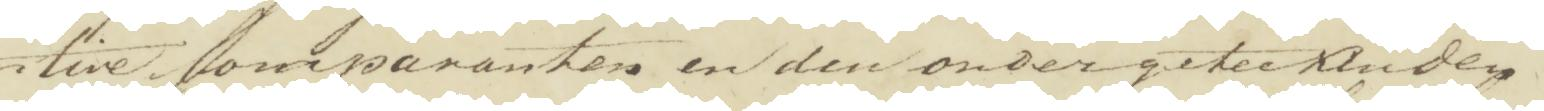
=tive Comparanten en den ondergeteekenden
